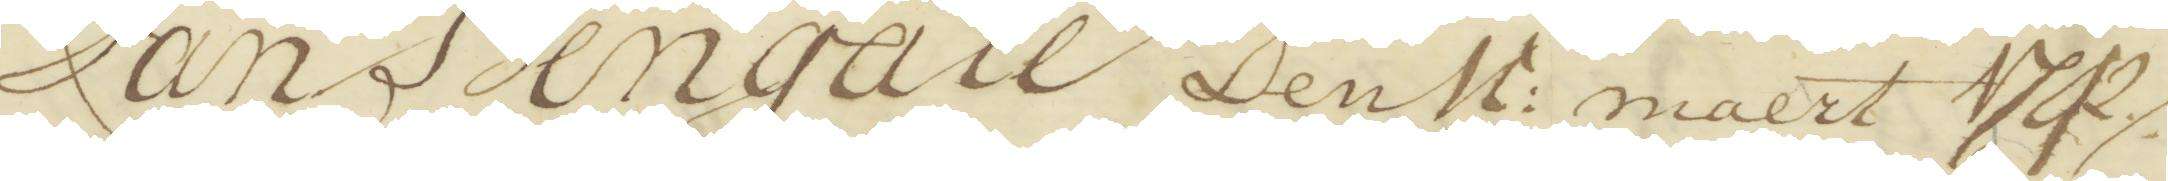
Van Bengale Den 15:e maert 1742.
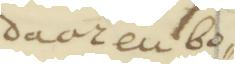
daar en bo„
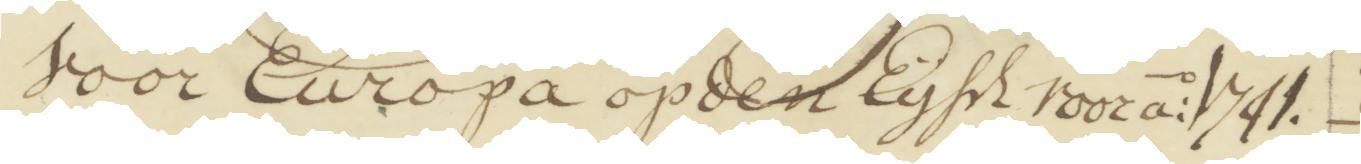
voor Europa op den Eijsch voor a:o 1741.
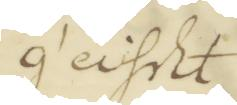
g’eischt
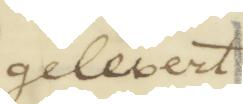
gelevert
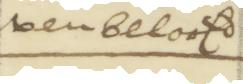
ven beloofd
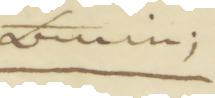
temin;
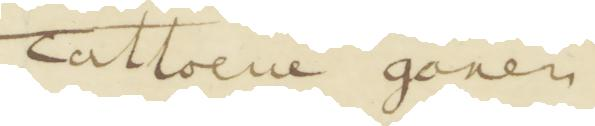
cattoene garen
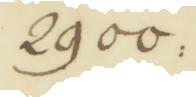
2900:
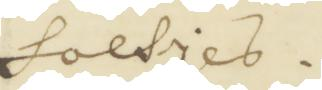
soesjes
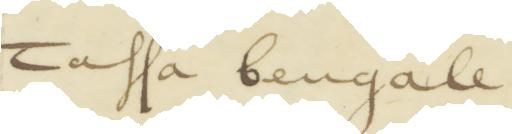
cassa bengale
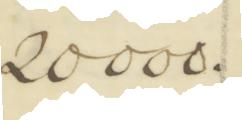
20000.
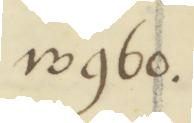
13960.
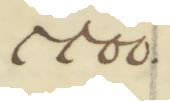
5500.
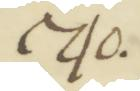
540.
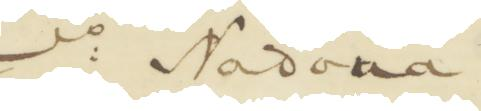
_:o Nadona
